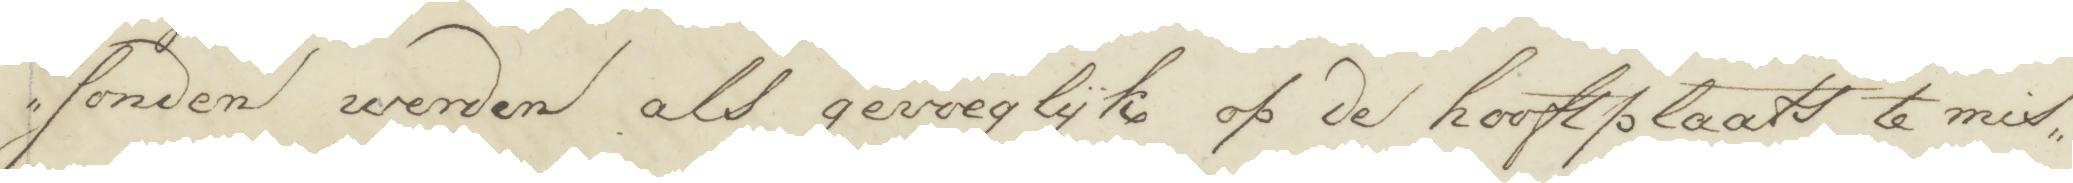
„sonden werden als gevoeglijk op de hooftplaats te mis„
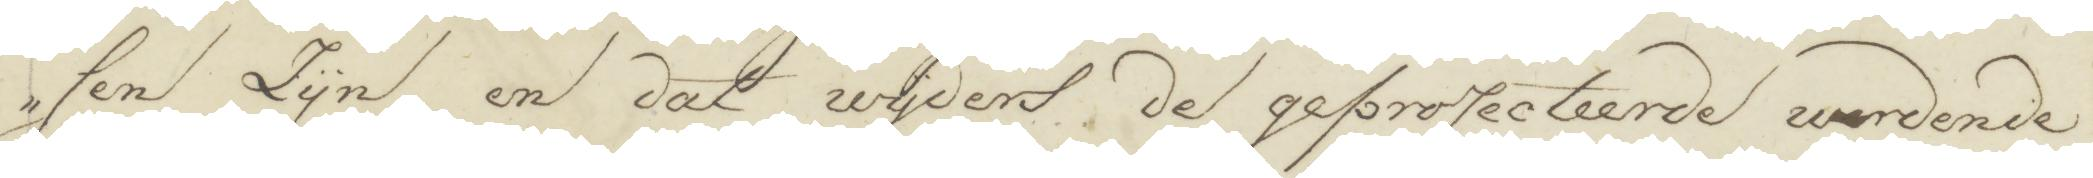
„sen zijn, en dat wijders de geprojecteerde werdende
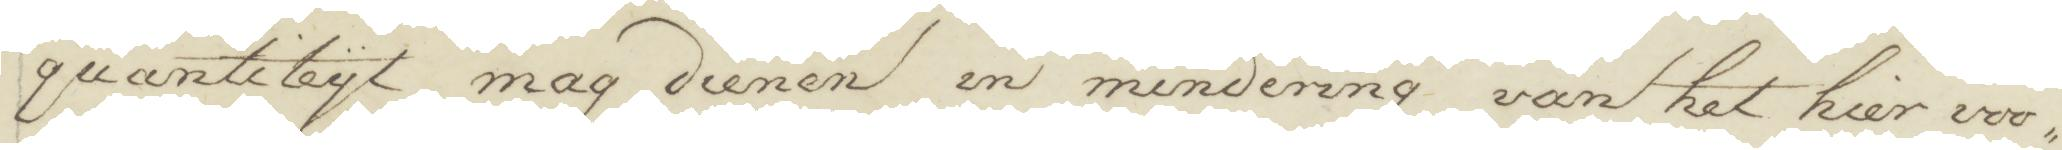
quantiteijt mag dienen in mindering van het hier voo„
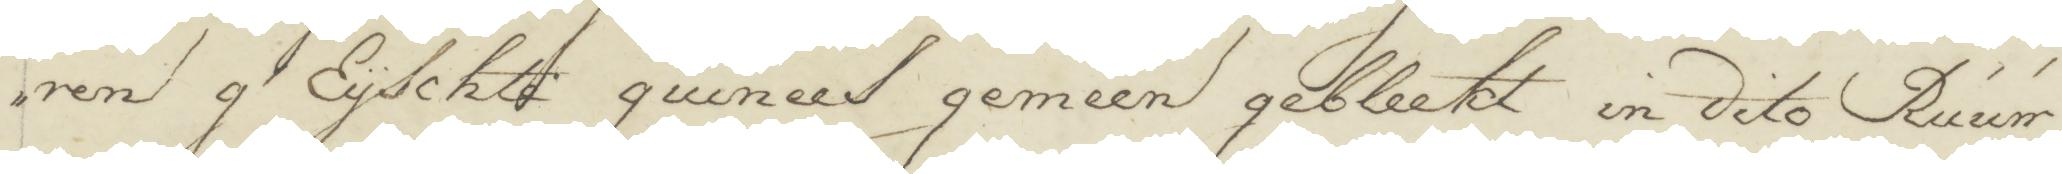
„ren g’ Eijschte guinees gemeen gebleekt in dito Ruuw
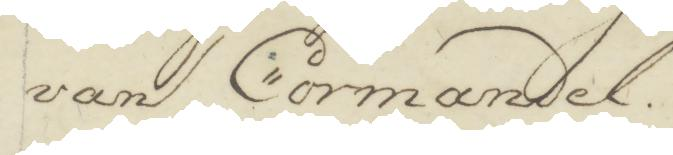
van Cormandel.
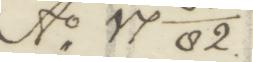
A„o 17 82/82.
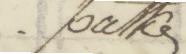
. pakken
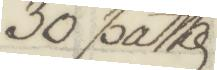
30 pakken
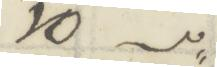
10 _„o
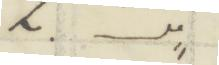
2. _„o
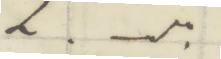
2. _.o
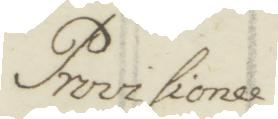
Provisionee
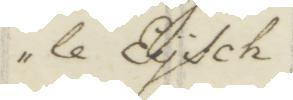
„le Eijsch
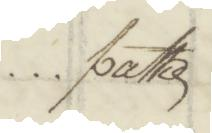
. . . pakken
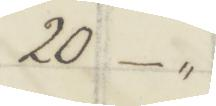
20 — „
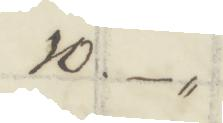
10. — „
